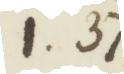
1. 37
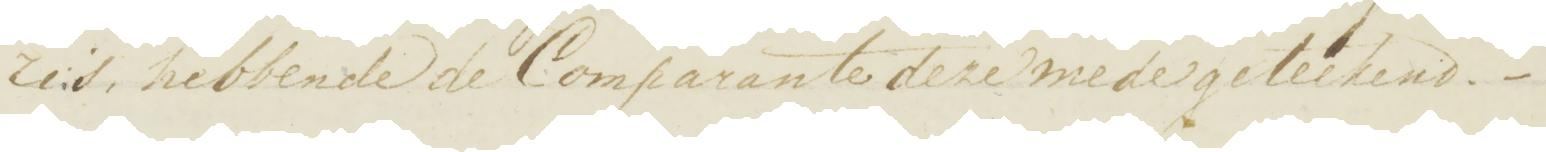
ris, hebbende de Comparante deze mede geteekend.
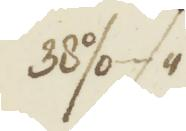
38% „
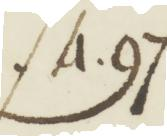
ƒ4.97
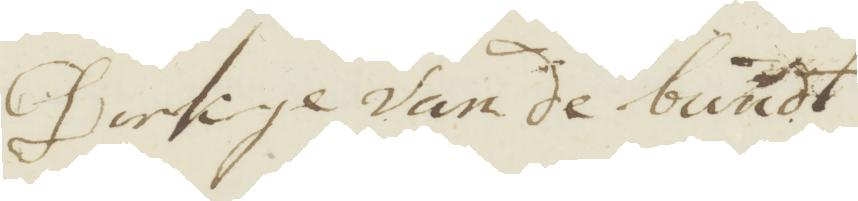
Dirkje van de bundt
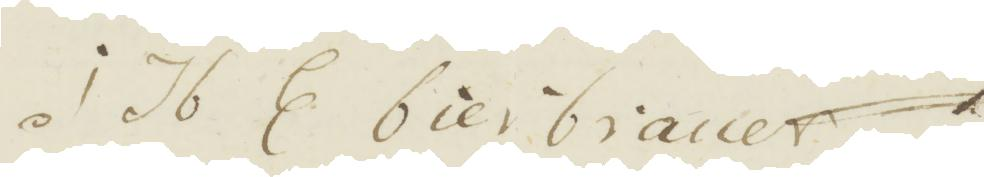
J H E bierbrauer
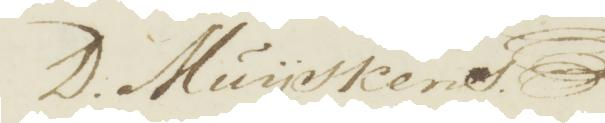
D. Muijskens
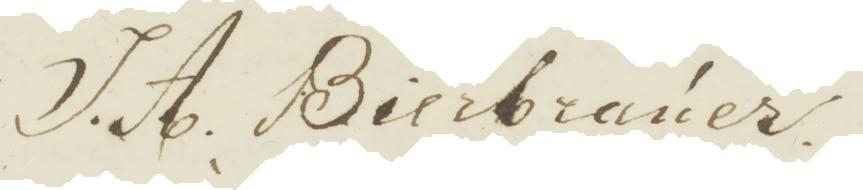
J. A. Bierbrauer.
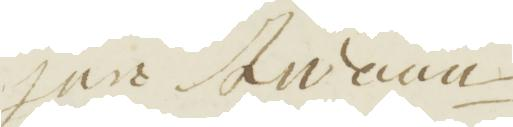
Jan Zwaan
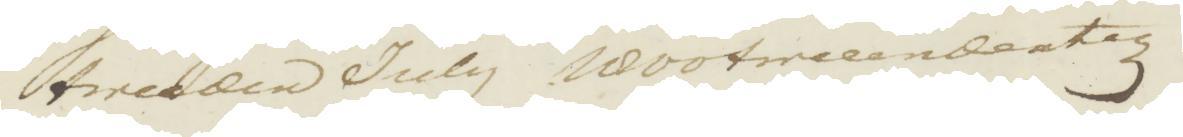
tweeden July 1800 tweeendertig
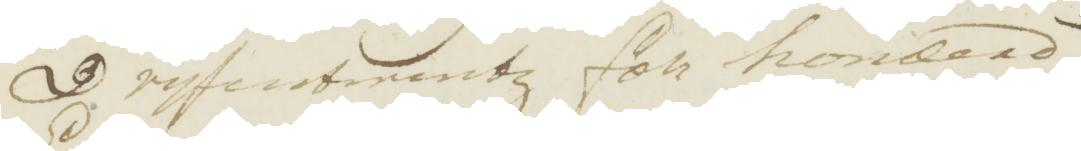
D vyfentwintig foli honderd
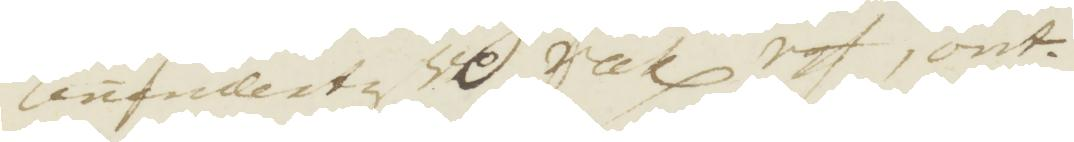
Eenendertig Vo Vak vyf, ont.
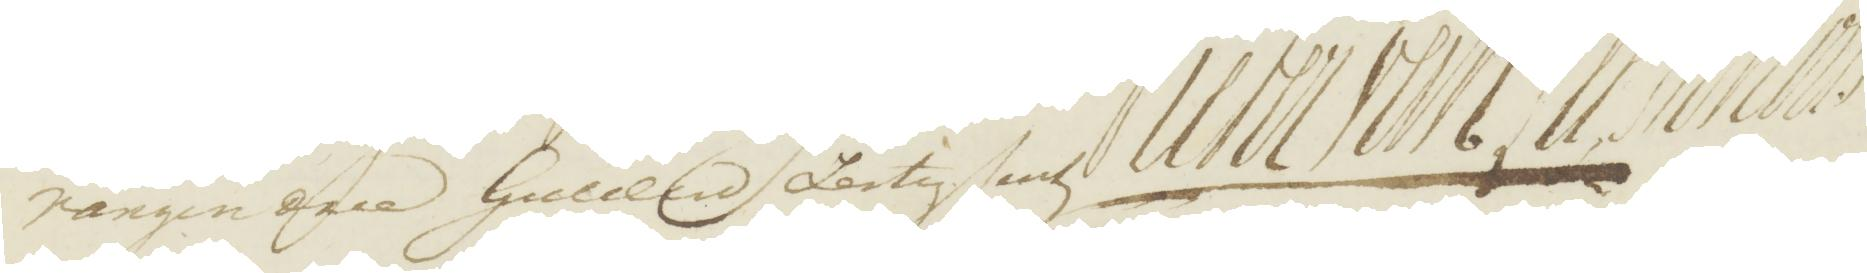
vangen drie Gulden zestig Cent Pieter van Leè, Notaris
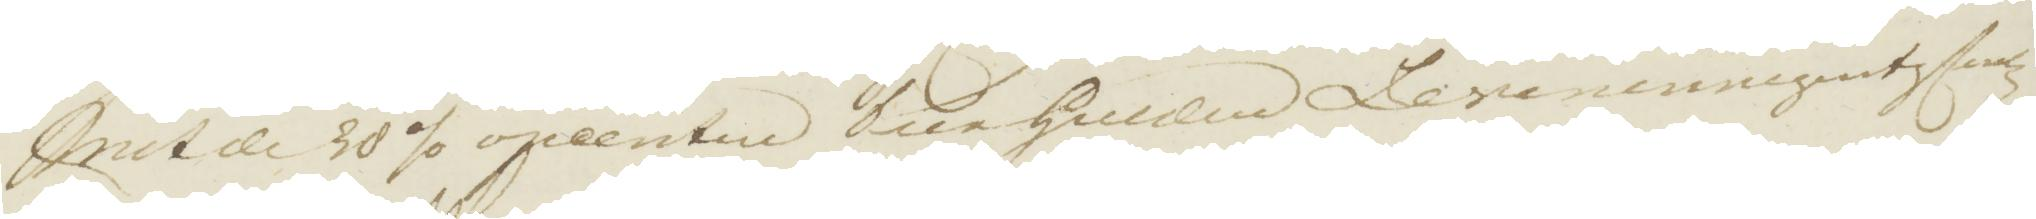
Met de 38% opcenten vier Gulden Zeven ennegentig Cent
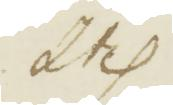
Zk
